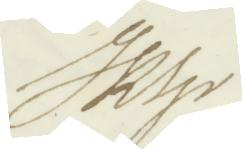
IKSjr
